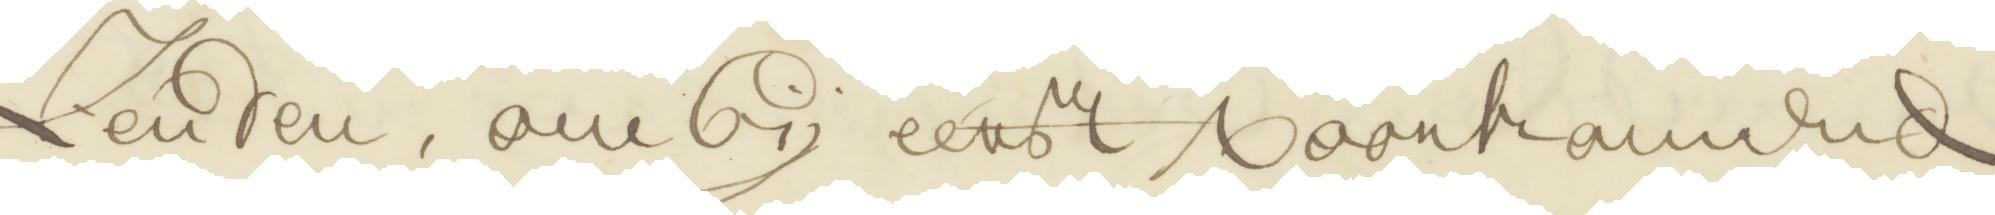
Zenden, om bij eerst voorkomende
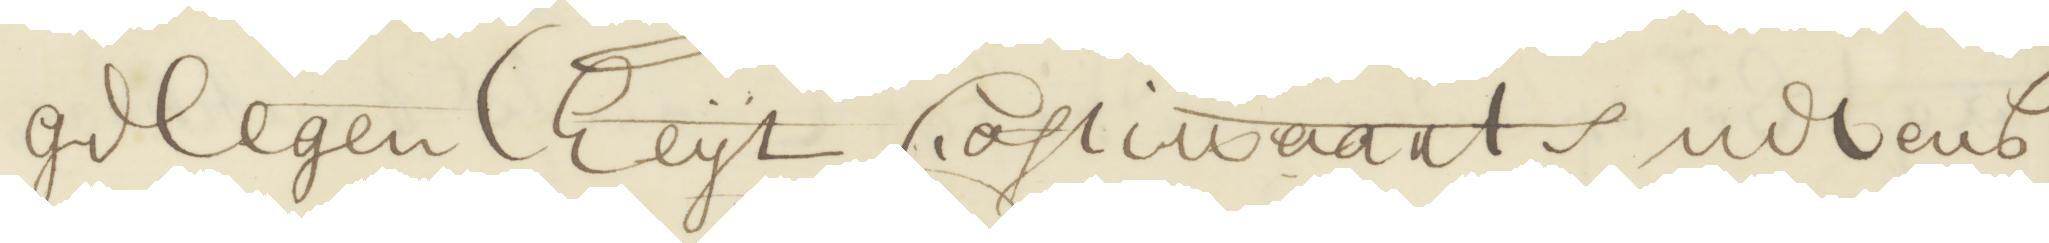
gelegentheijt Costiwaarts nevens
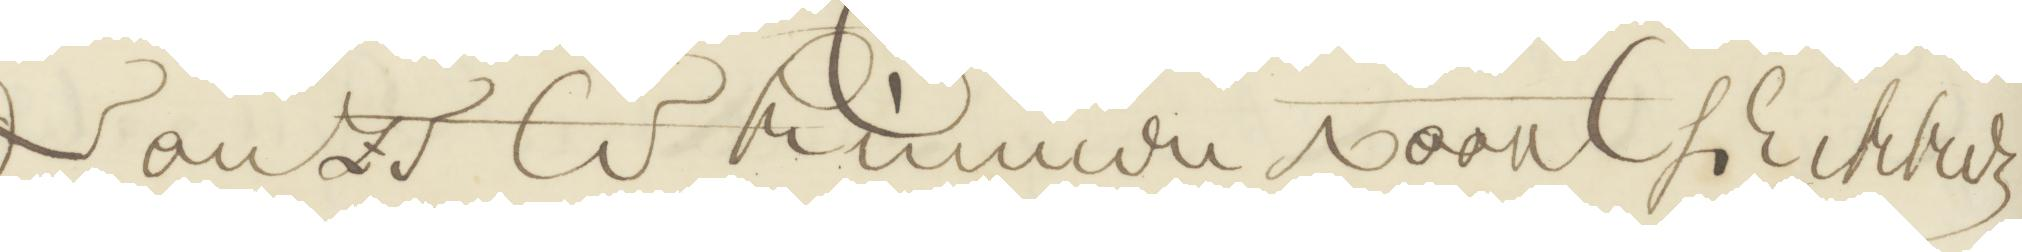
de onze te kunnen voort schikken
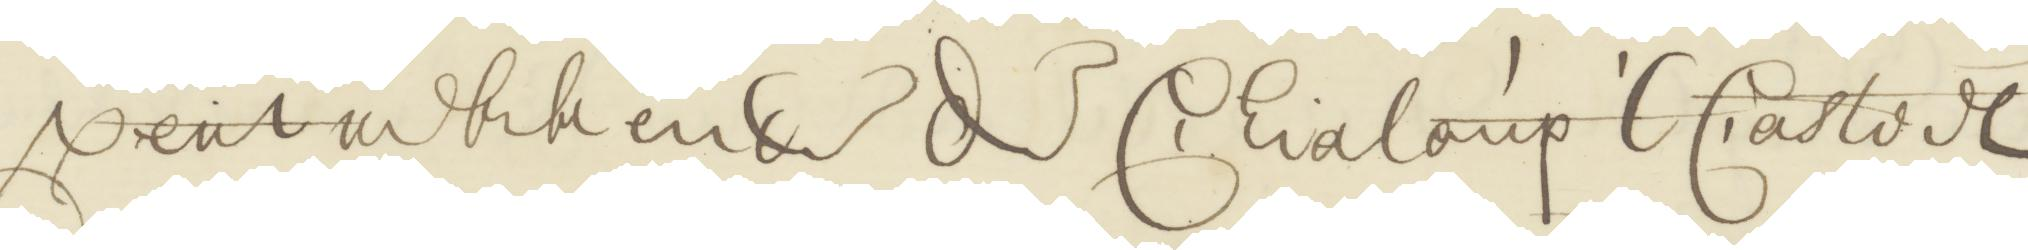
vertrekkende de Chialoup 't Casteel
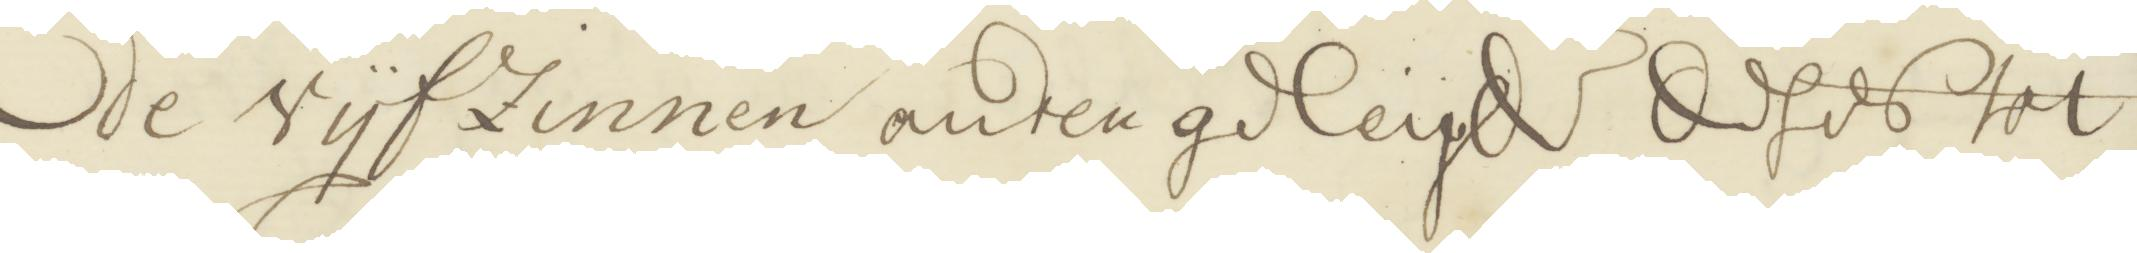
de vijf zinnen onder geleijde deses tot
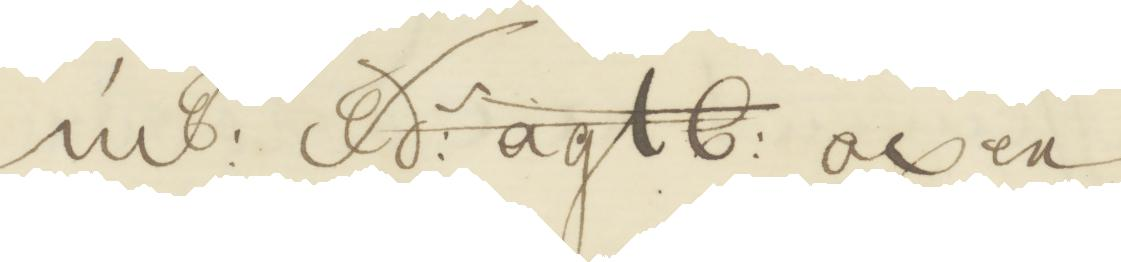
uE: Ed:e agtb: over
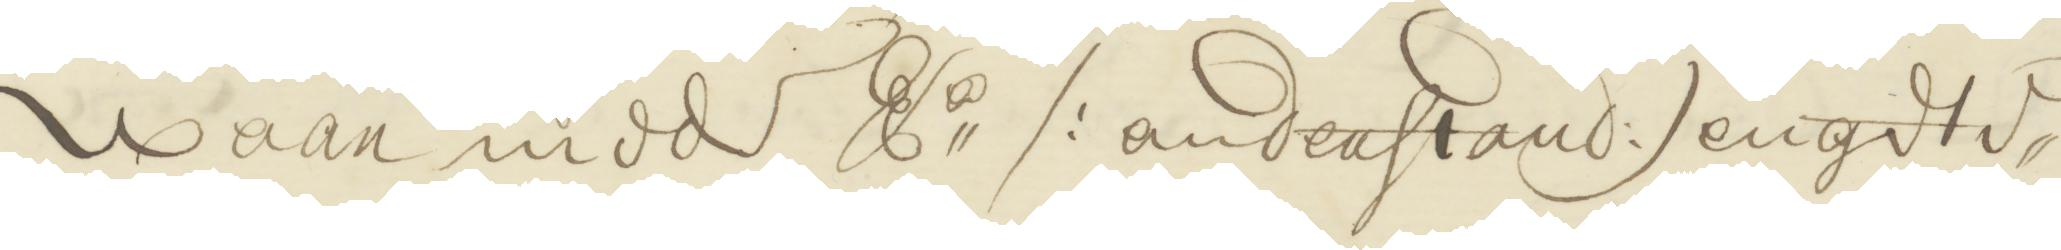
Waar mede Et„a /:onderstond:/ en gete„
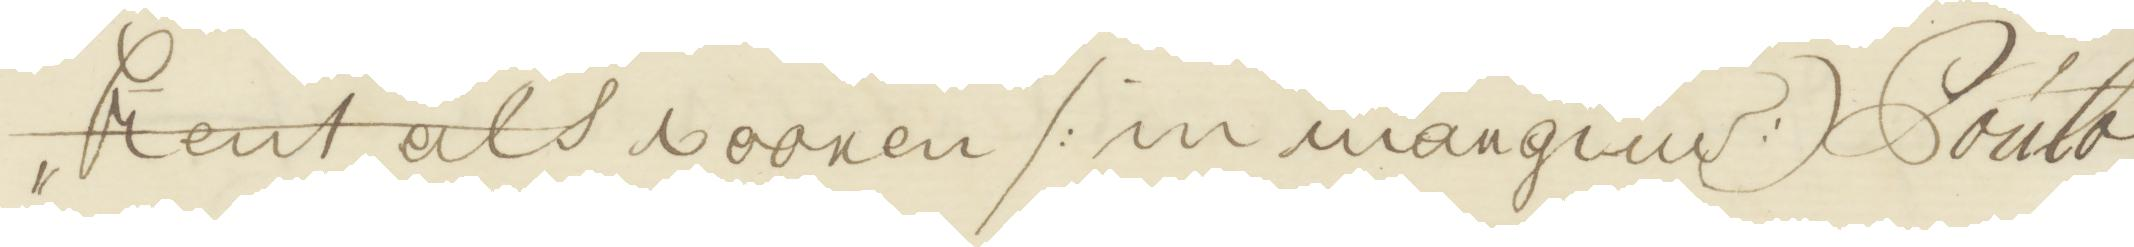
„kent als vooren /:in margine:/ Poulo
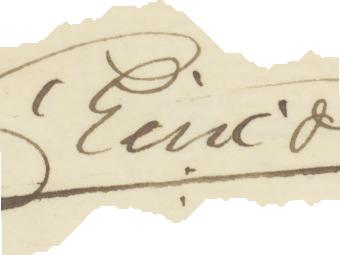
Chinco
